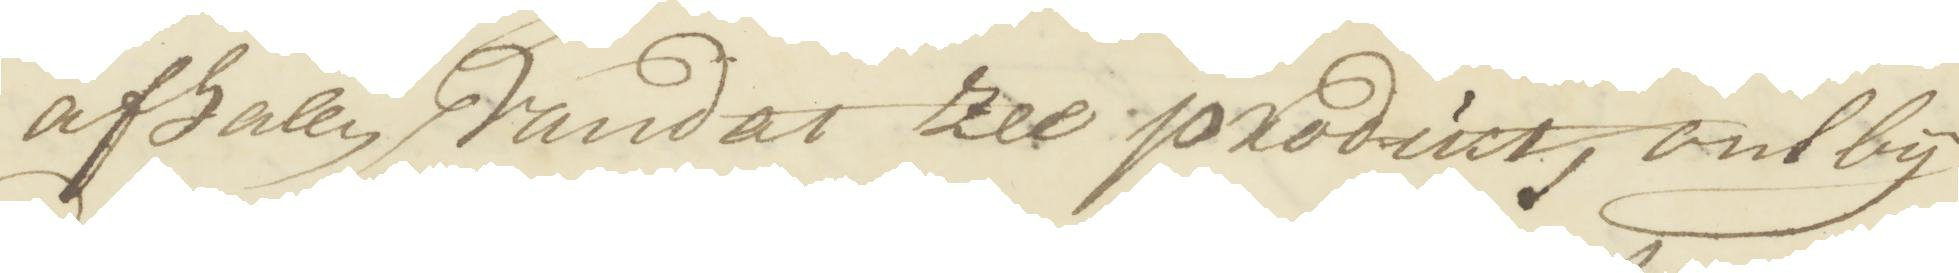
afhalen vandat zee product, ons bij
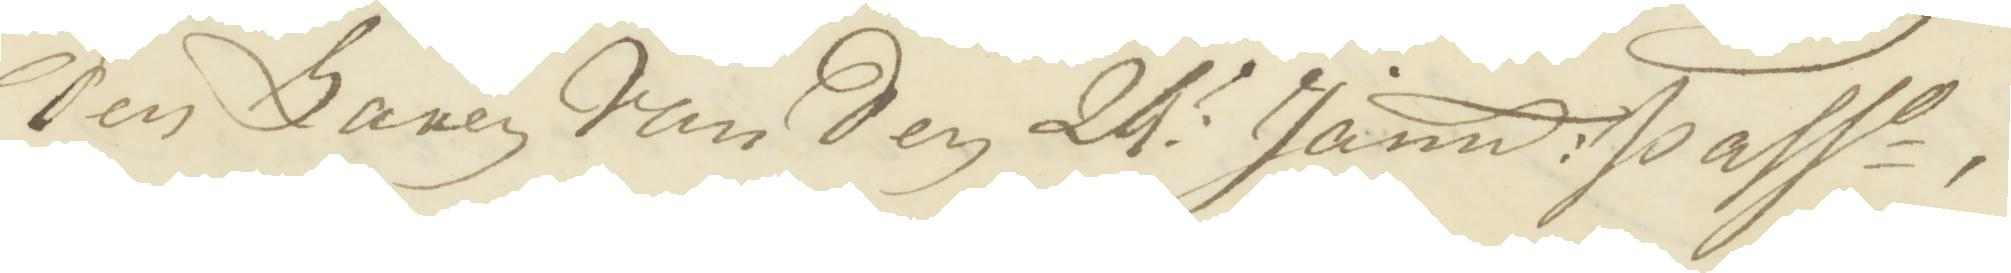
den haren van den 24:' Jann: pass=o,
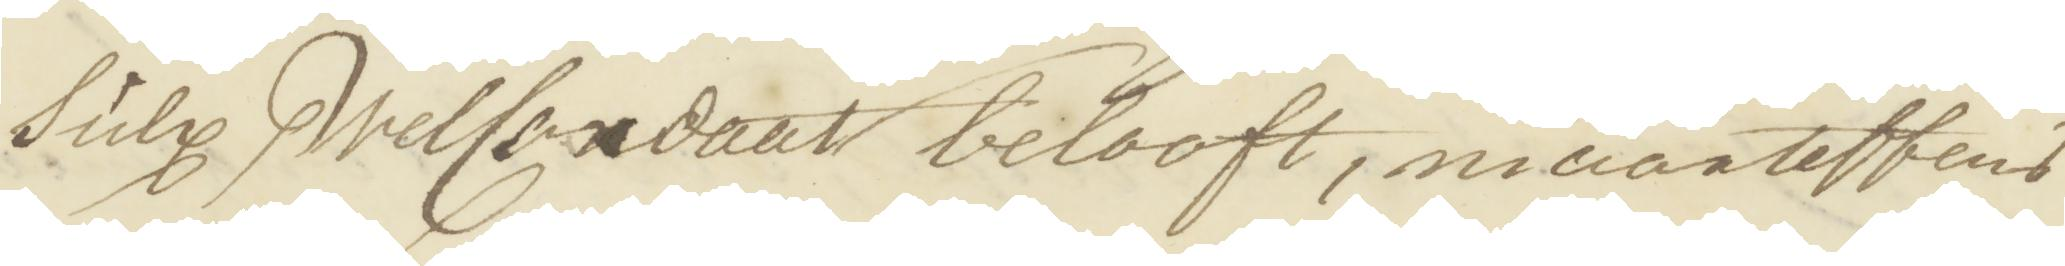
sulx Welcordaat belooft, maar teffens
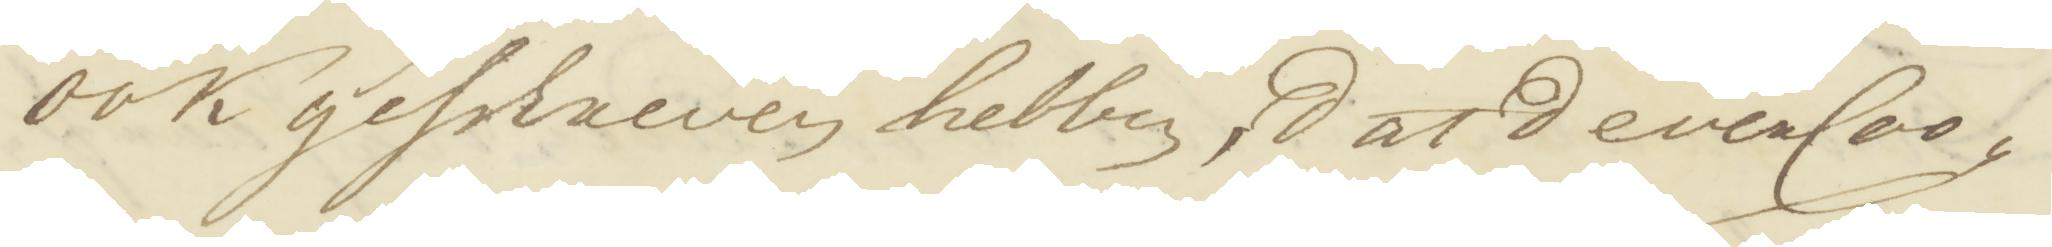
ook geschreven hebben, dat de vercoo„
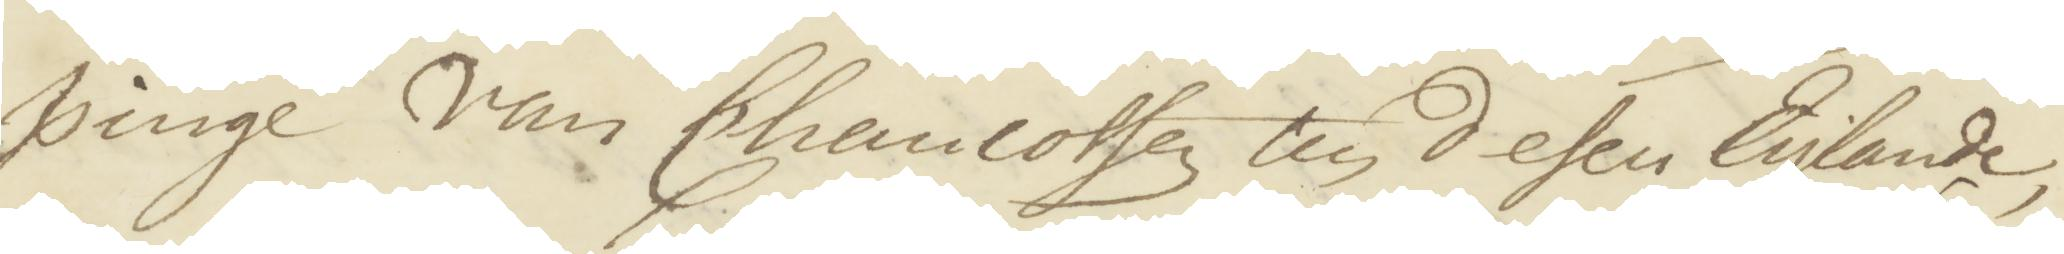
pinge van Chancossen ten desen Eijlande,
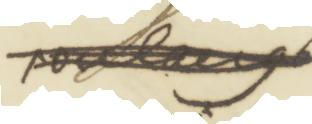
^ onlangs
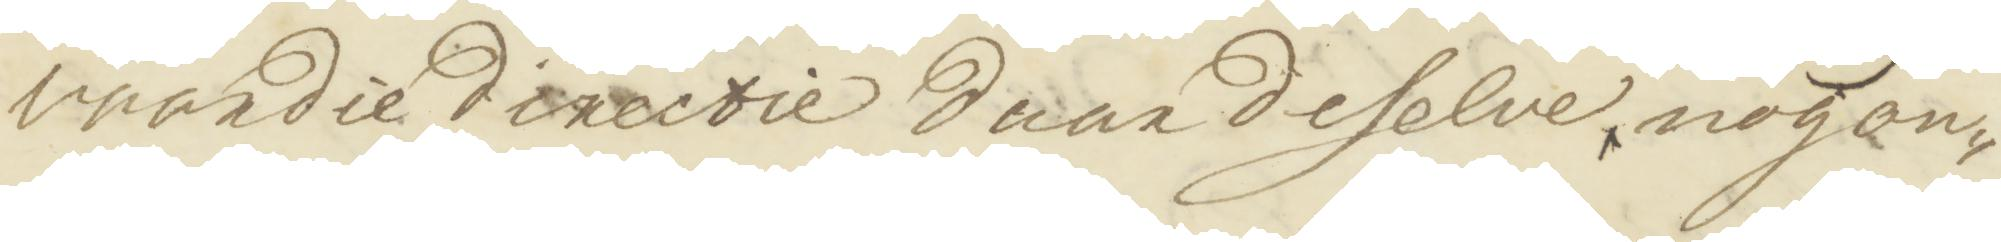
voor die directie daar deselve ^ nog on„
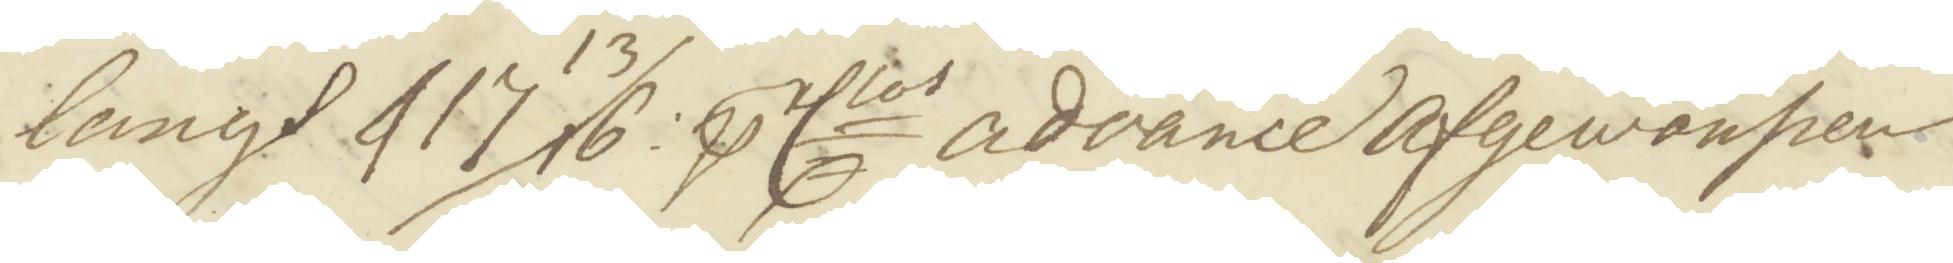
langs 417 13/16: pr C=tos advance afgeworpen
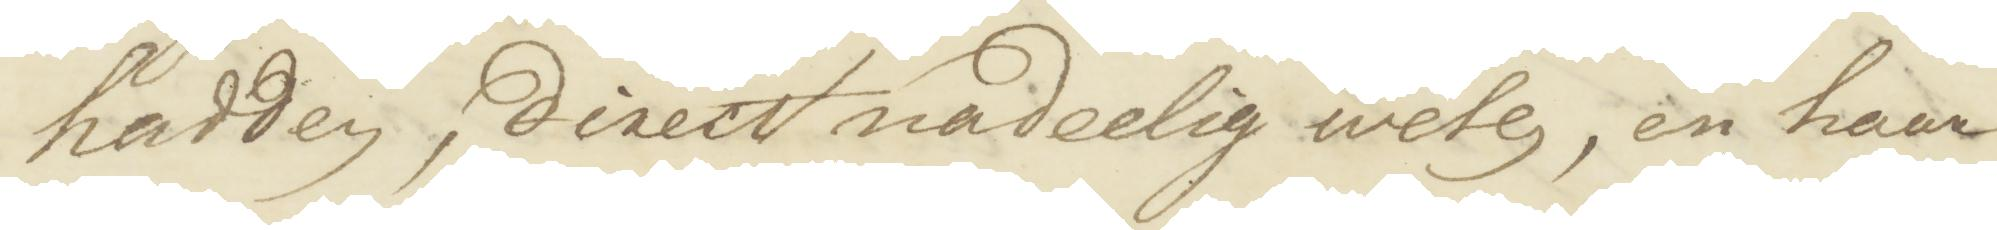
hadden, direct nadeelig wesen, en haar
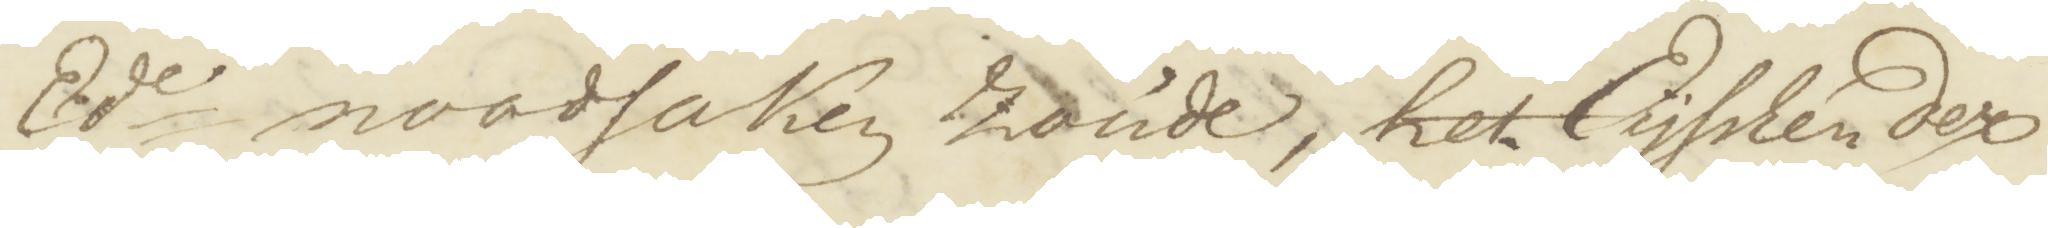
Ed=e noodsaken zoude, het Eijschen der
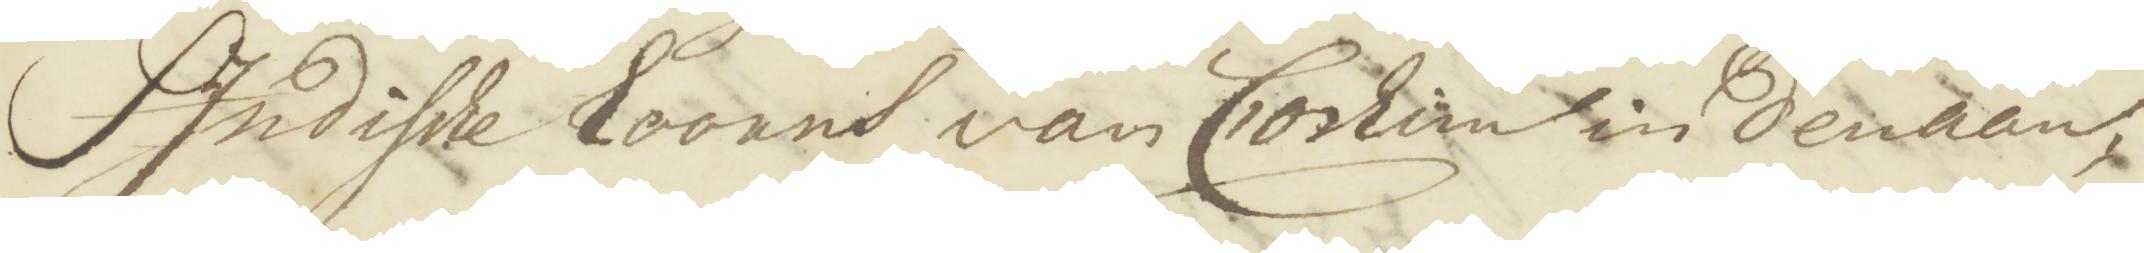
S Jndische hoorns van Cochim in den aan„
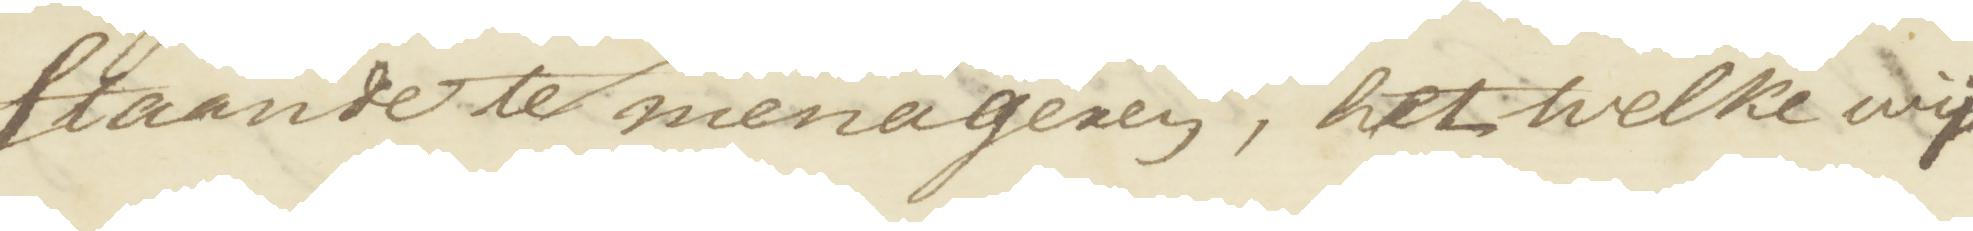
staande te menageren, het welke wij
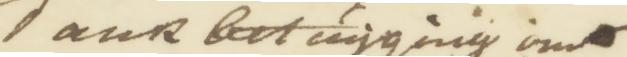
dank betuijging om
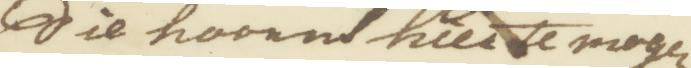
die hoorns hier te mogen
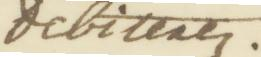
debiteren.
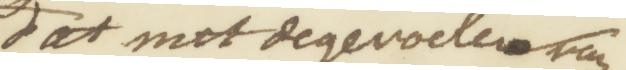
dat met de gevoelen van
